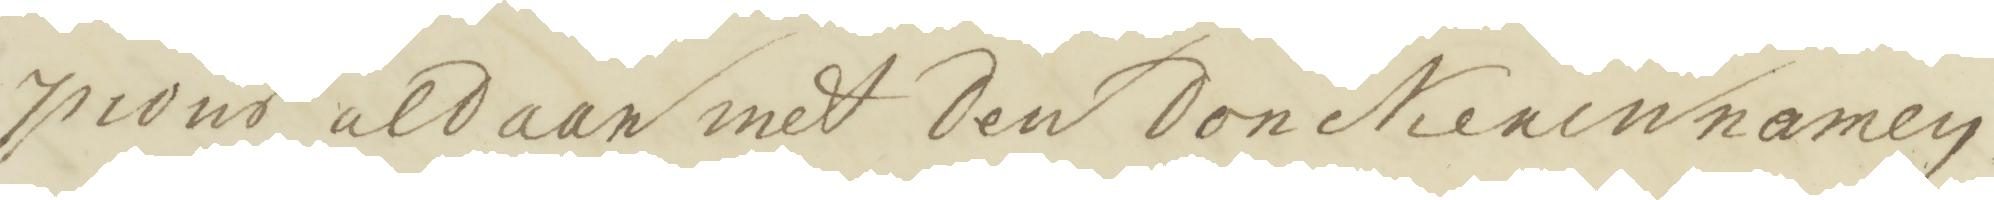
pions aldaar met Den Doncker innamen
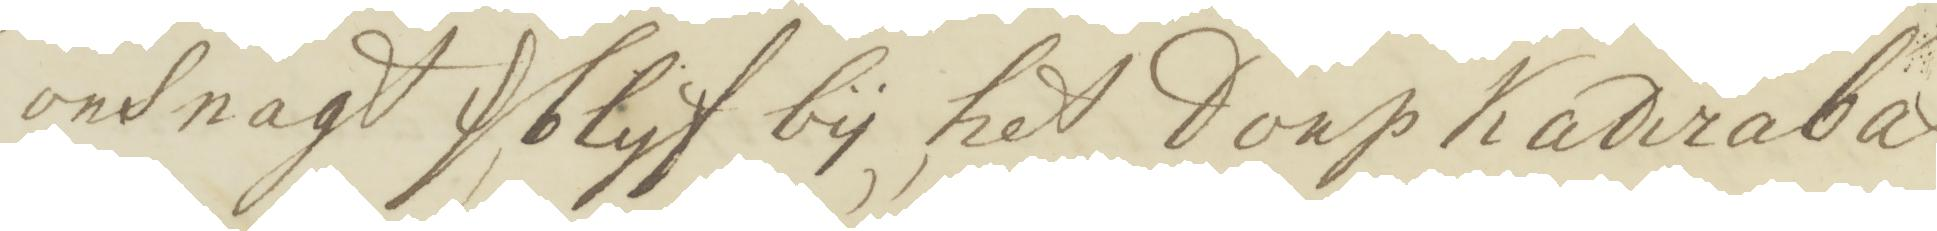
ons nagtverblijf bij het Dorp Kadirabas,
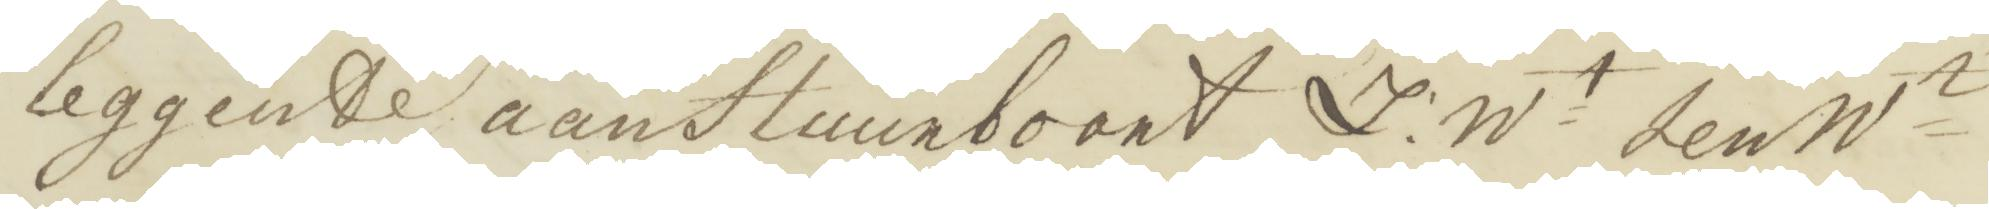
leggende aan Stuurboort Z: w:t ten W=t
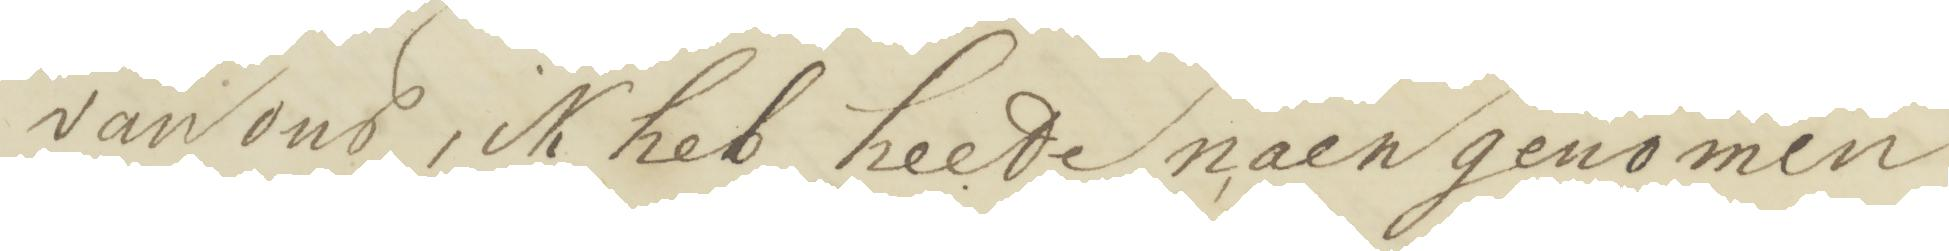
van ons, ik heb heede naer genomen
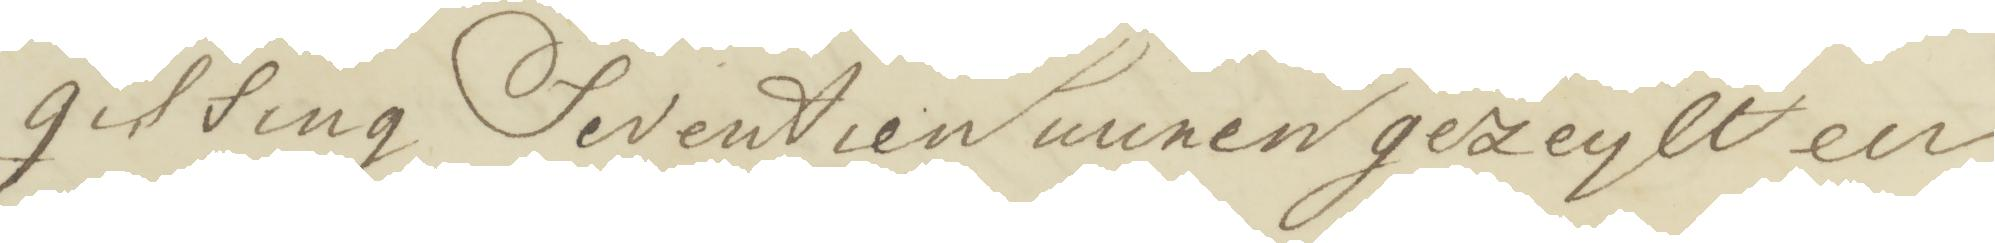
gissing Seventien uuren gezeijlt en
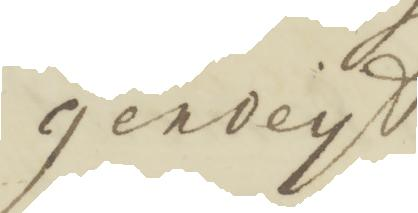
geroeijt
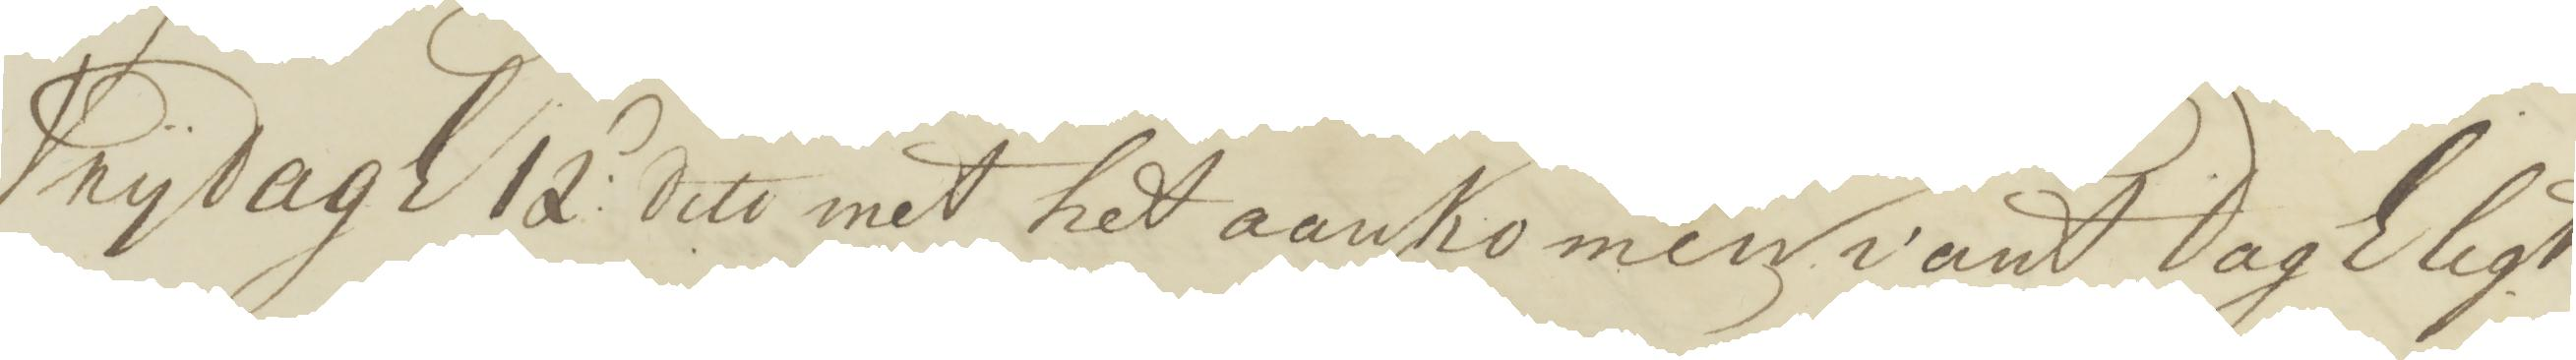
Vrijdagh 12:' dito met het aankomen van't Daghligt
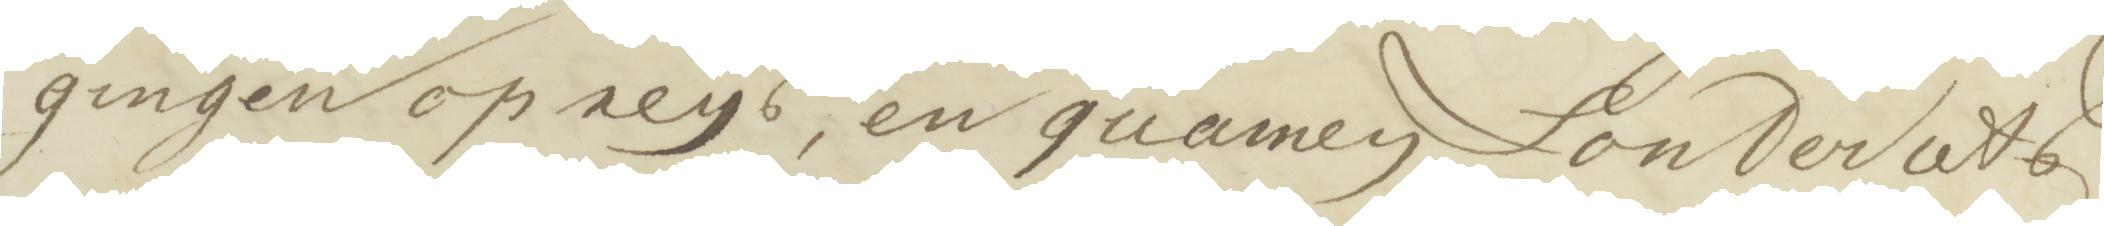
gingen op reijs, en quamen Sonder iets
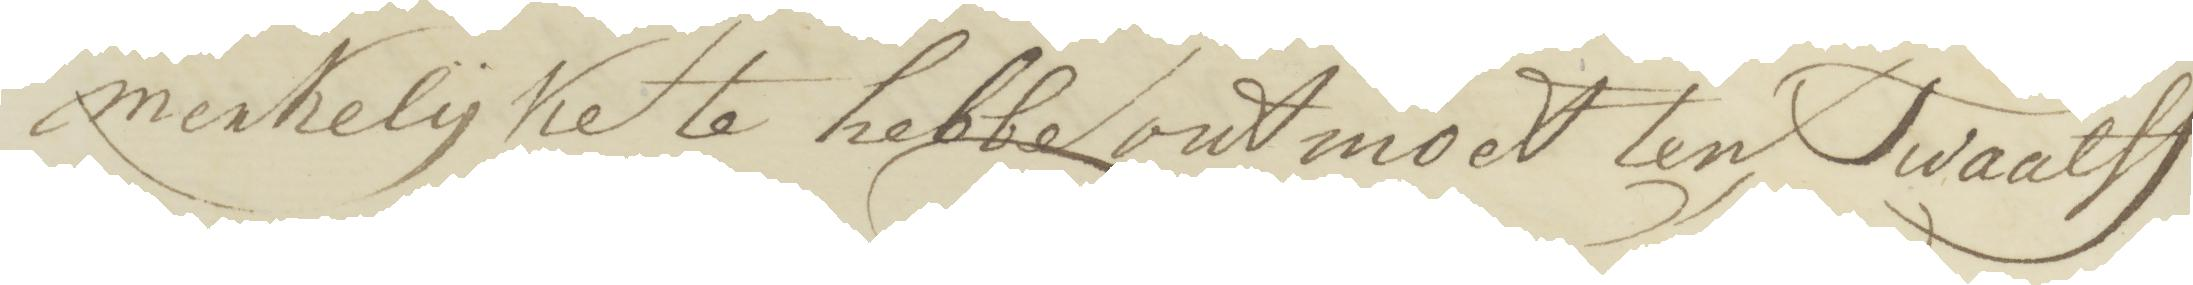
merkelijke te hebbe ontmoet ten, Twaalf
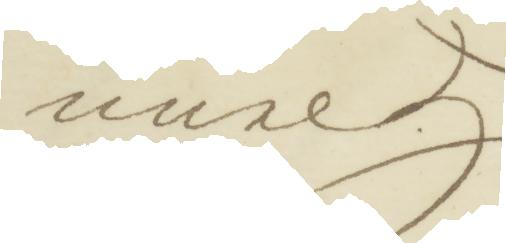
uure
